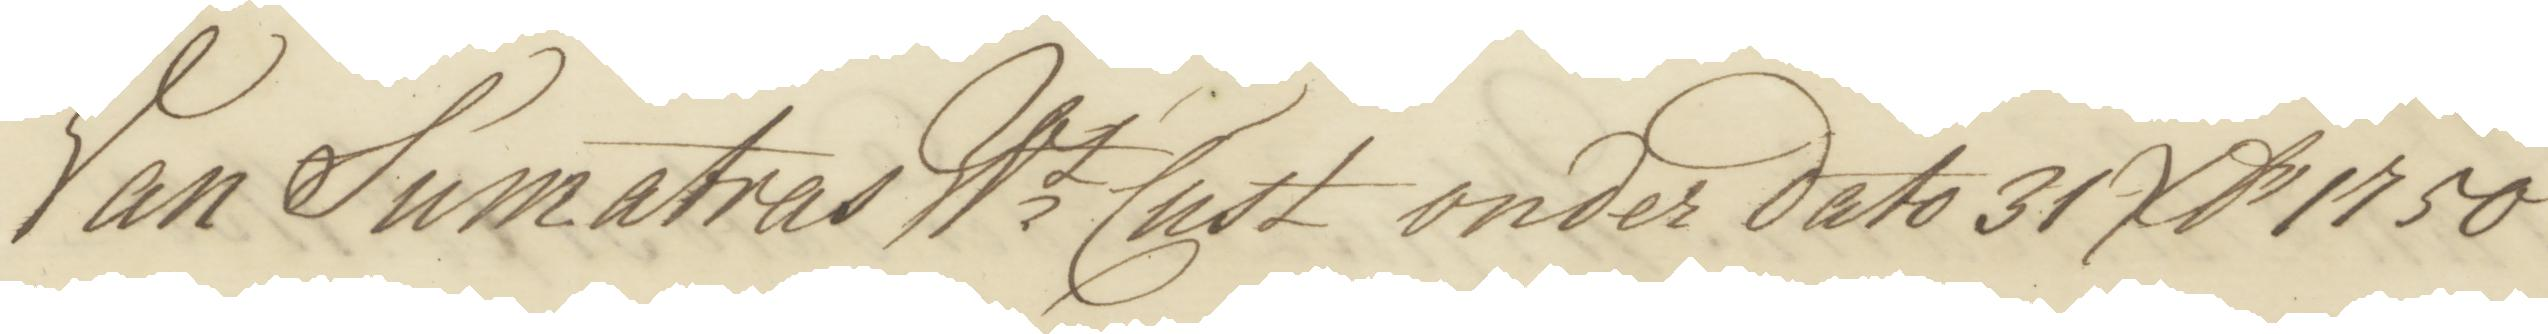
Van Sumatras W=t Cust onder dato 31 Xbo 1750
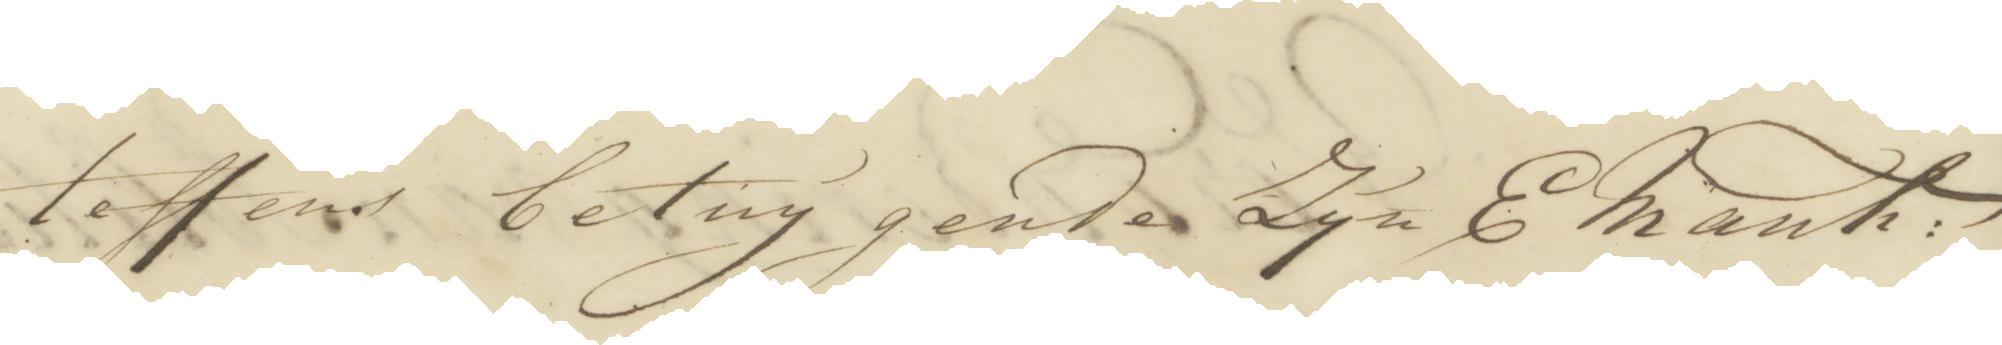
teffen betuijgende Zijn E manh:'
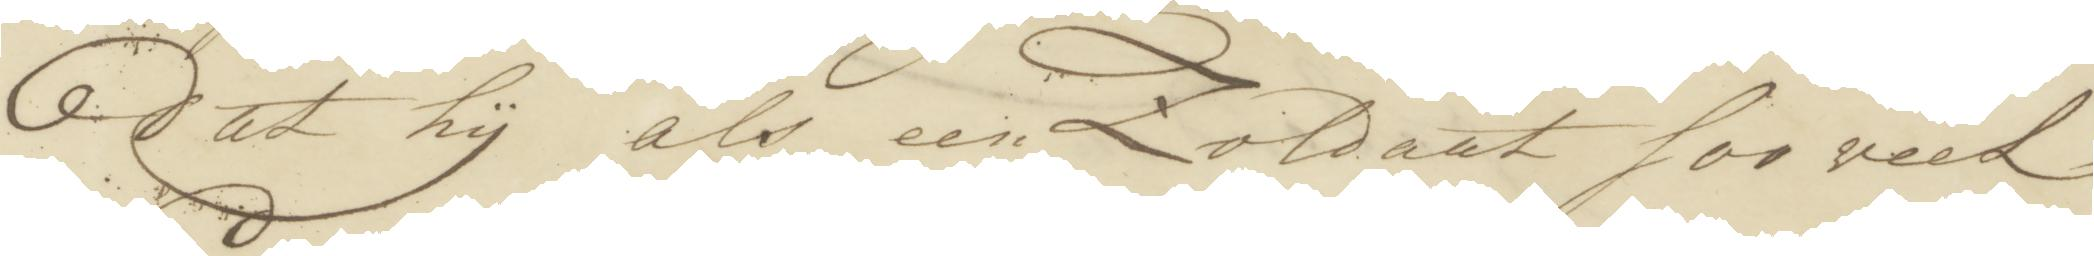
dat hij als een Zoldaat soo veel
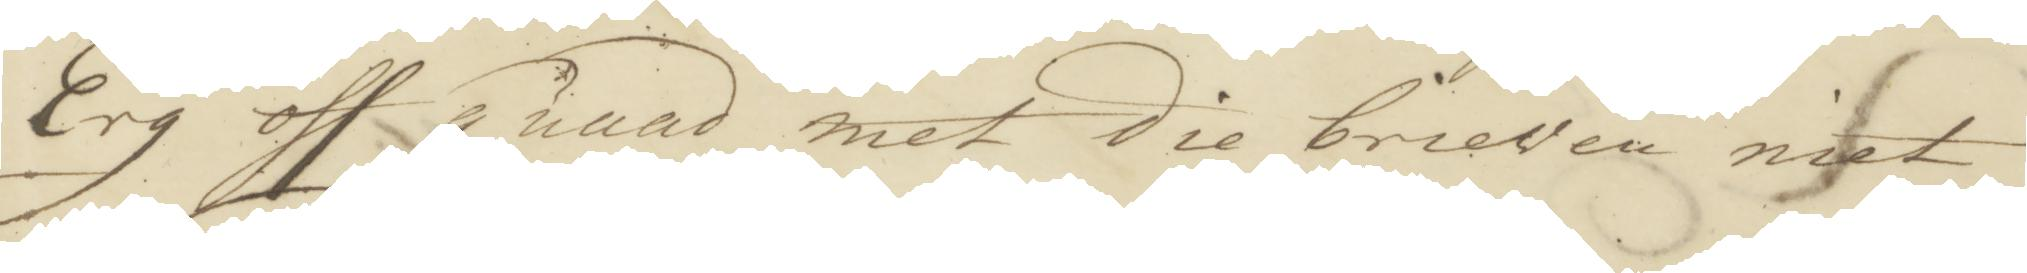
Erg off quaad met die brieven niet
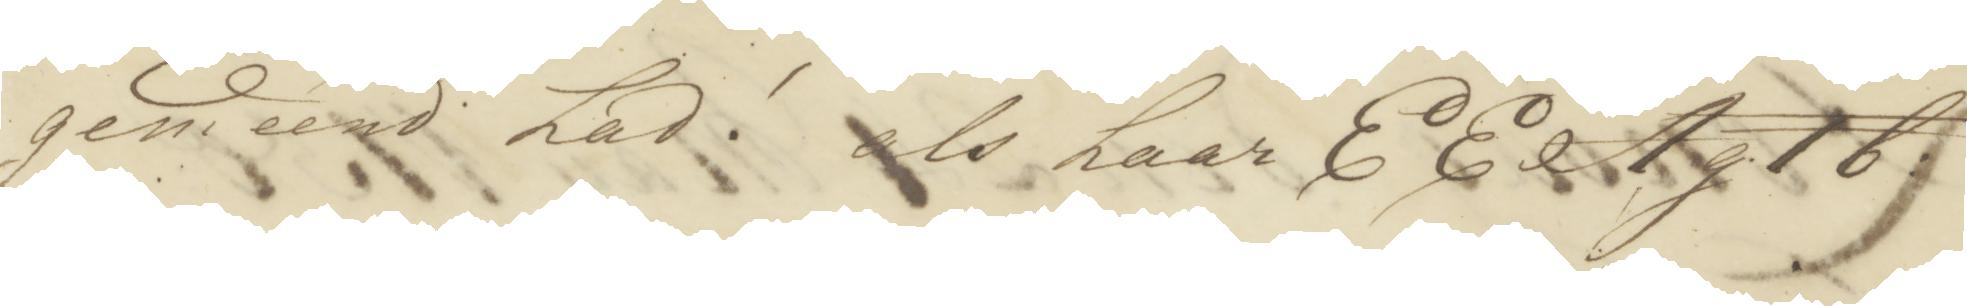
gemeend had.' als haar E E etgtb:
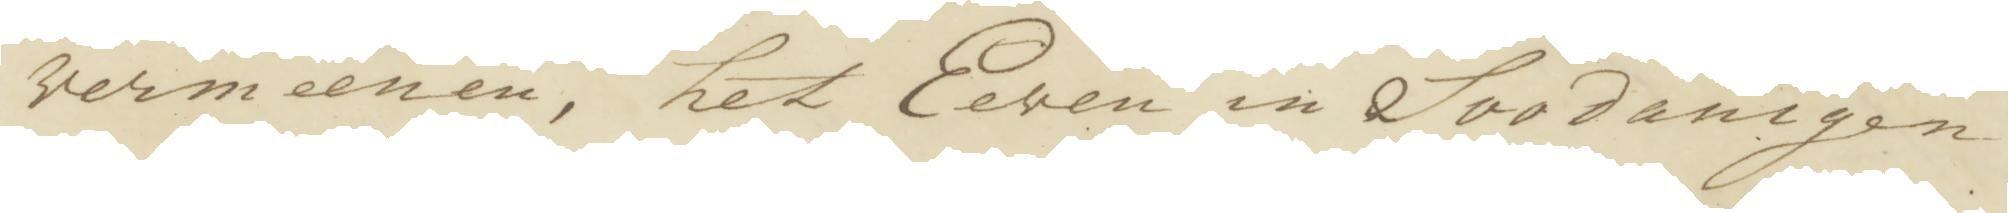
vermeenen, het Eeven in Soodanigen
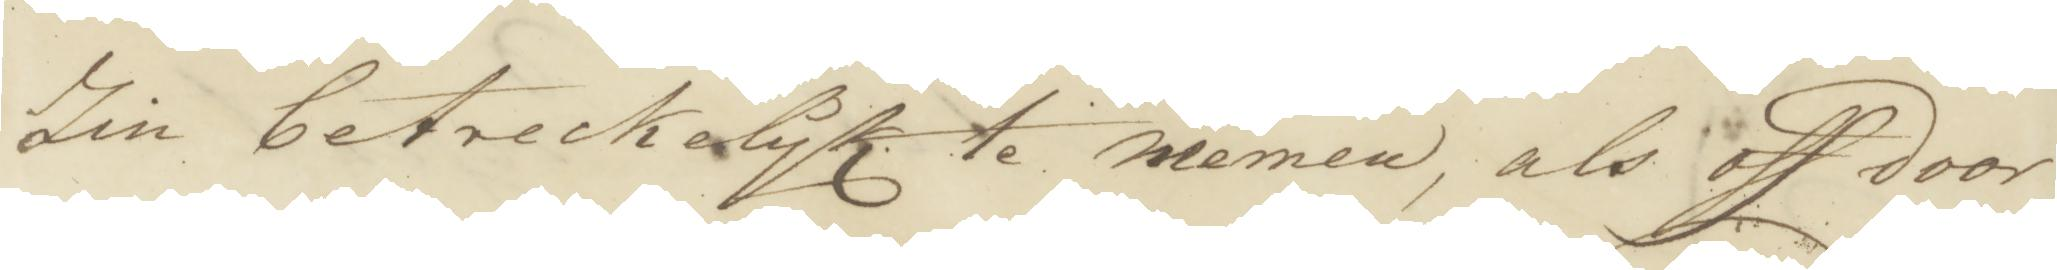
Zin betreckelijk te neemen, als off door
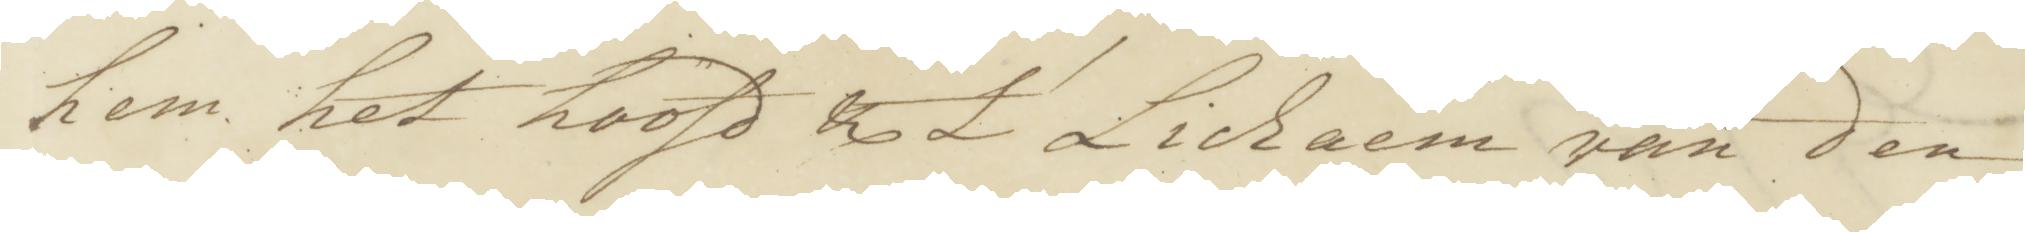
hem het hoofd & t' Lichaem van den
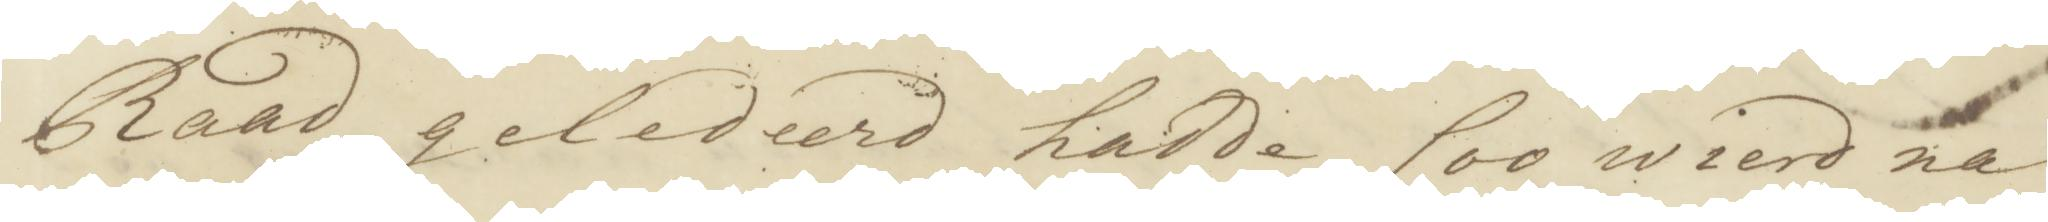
Raad geledeerd hadde, soo wierd na
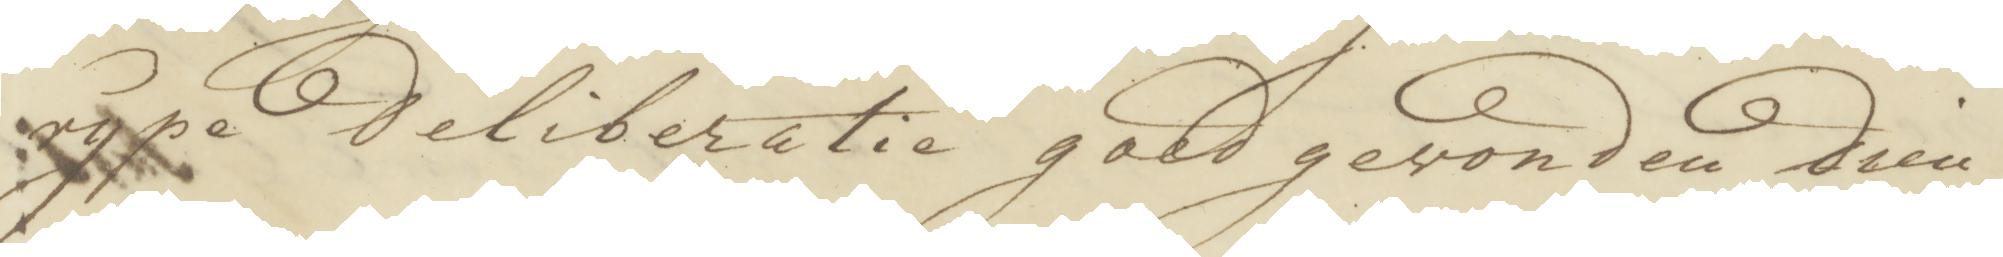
rijpe deliberatie goed gevonden dien
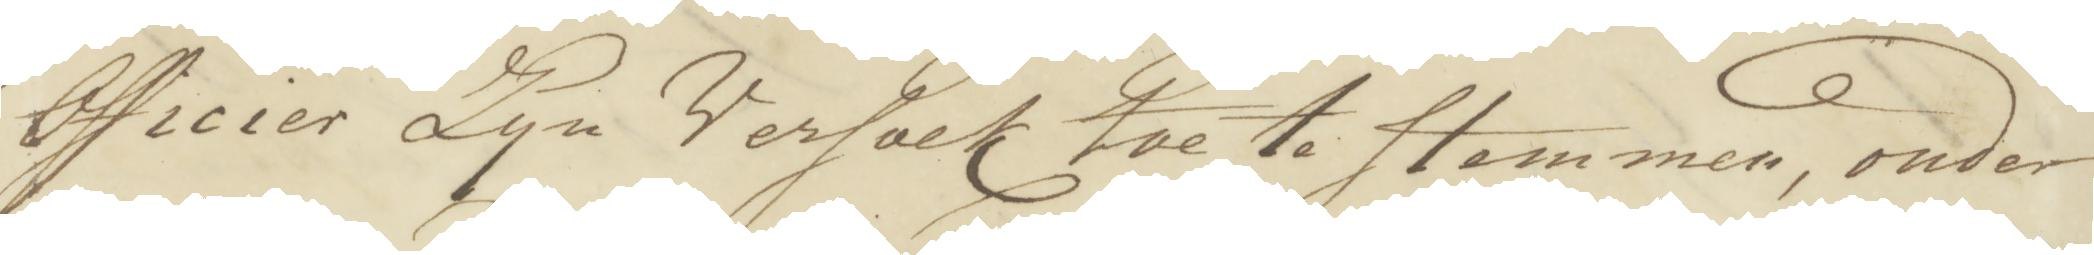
Officier Zijn Versoek toe te stemmen, onder
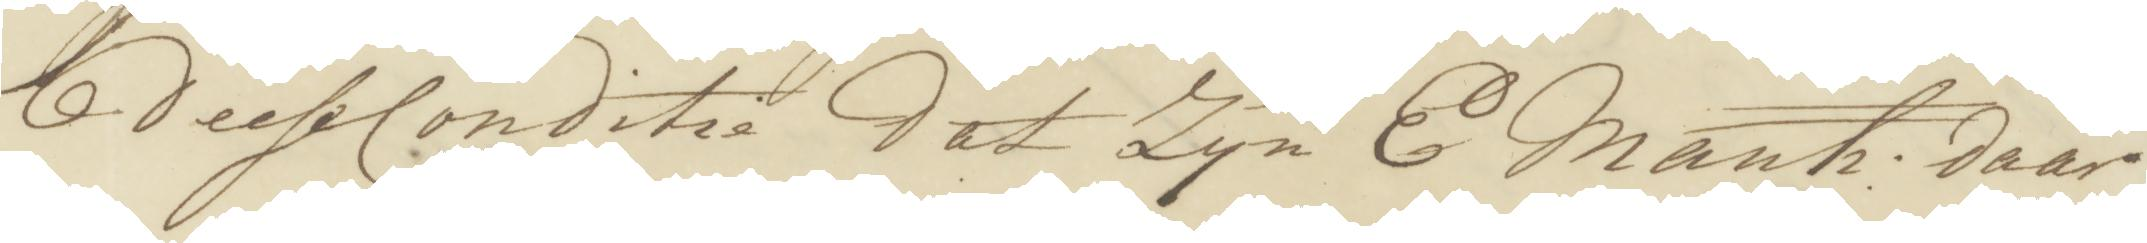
deese conditie dat Zijn E: manh: daar
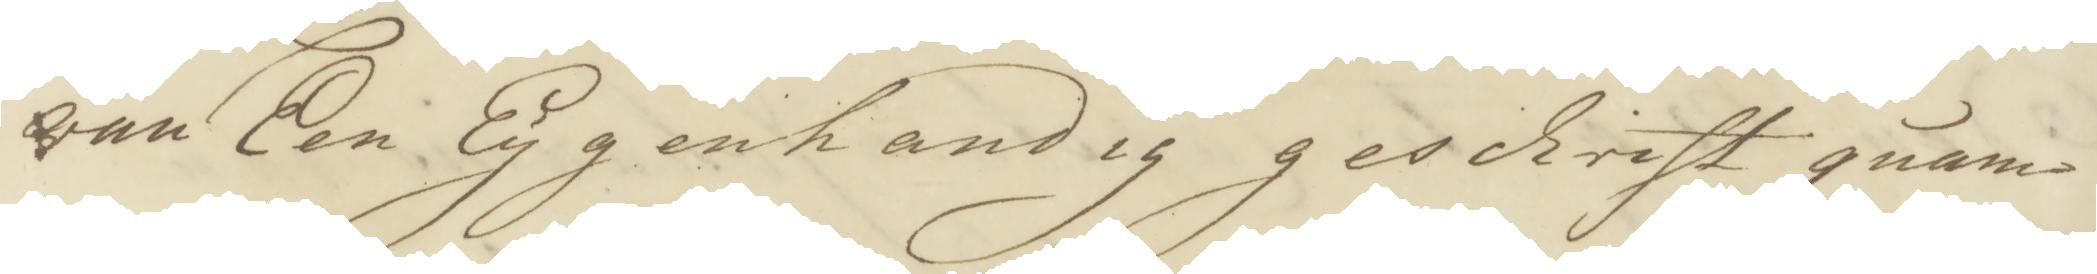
van Een Eijgenhandig geschrift quam
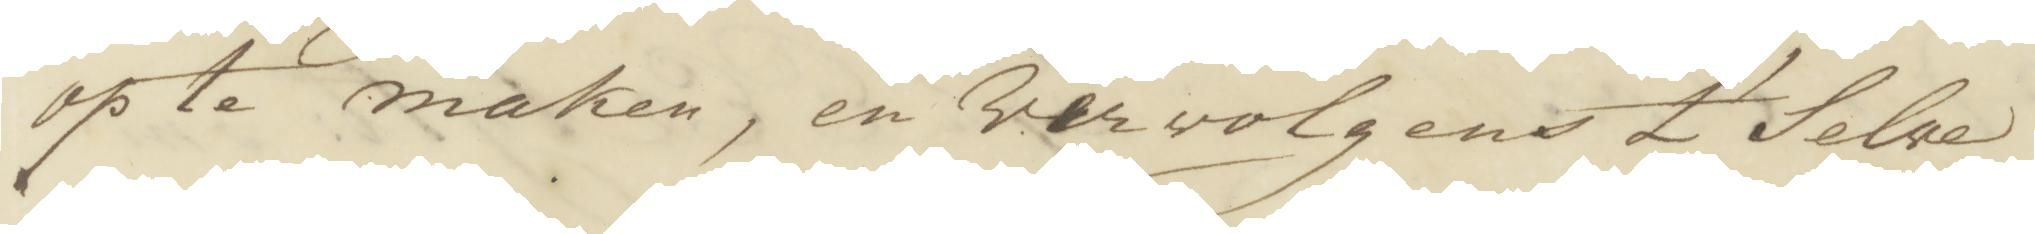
op te maken, en vervolgens t' Selve
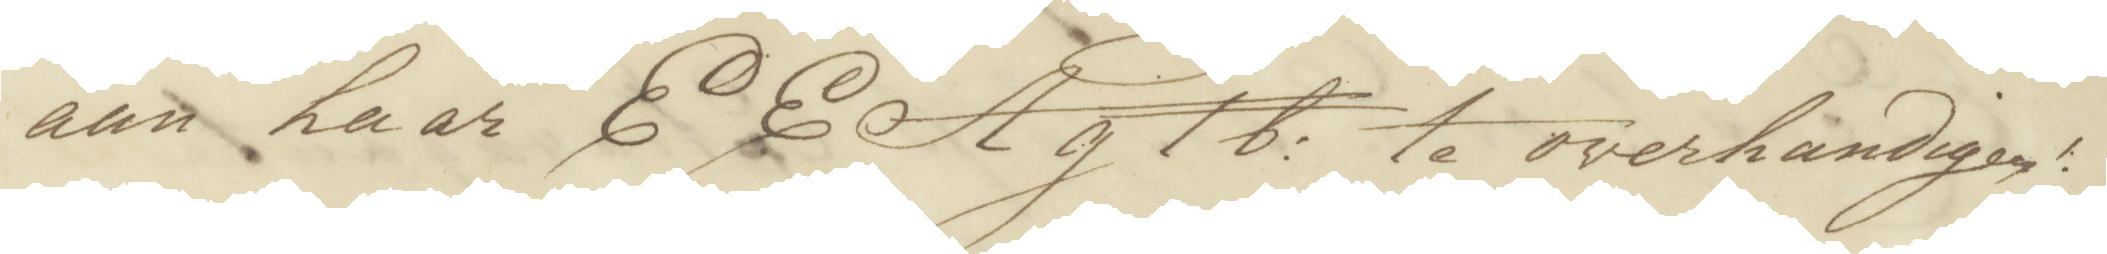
aan haar E E Agtb: te overhandigen;
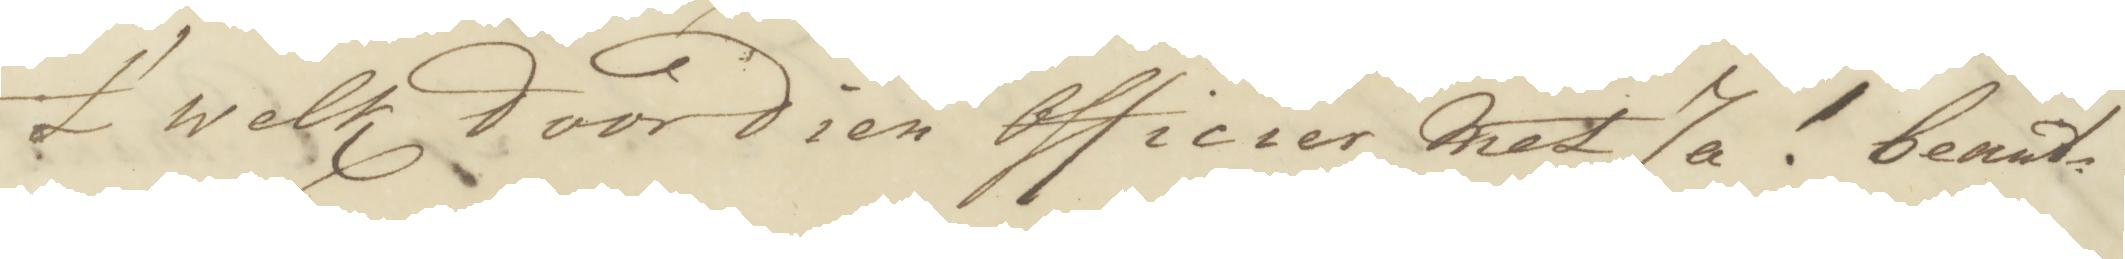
t' welk door dien Officier met Ja! beant-
